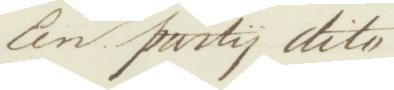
Een partij dito
